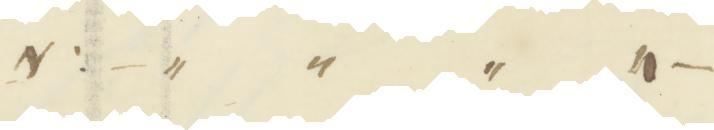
1: – „ „ „ 4.–
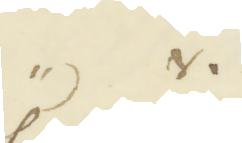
„ 1. –
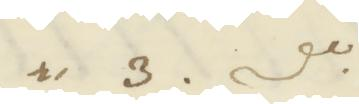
„ 3._.o
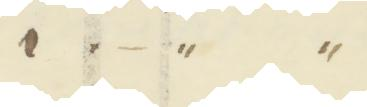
1. „ „
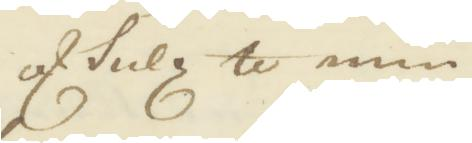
oversulx te min
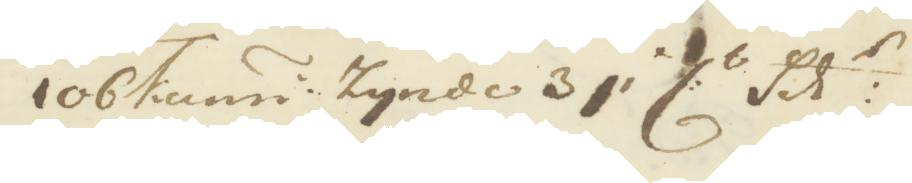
106 kann: Zijnde 3 pr C:t sch:s
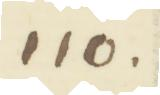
110. —
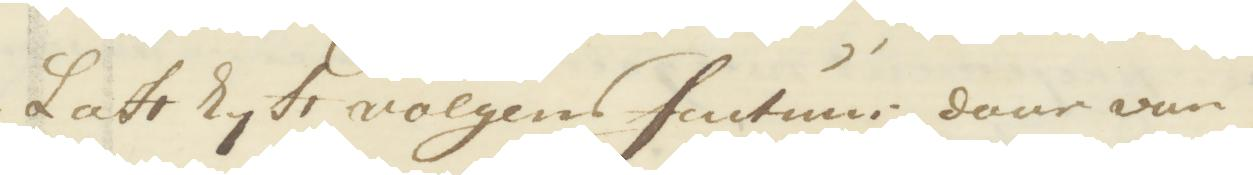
Last ryst volgens factuur; daar van
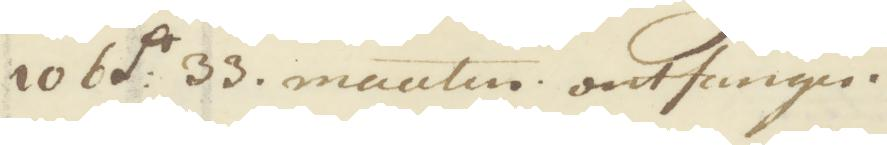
106 L:t 33. maaten. ontfangen.
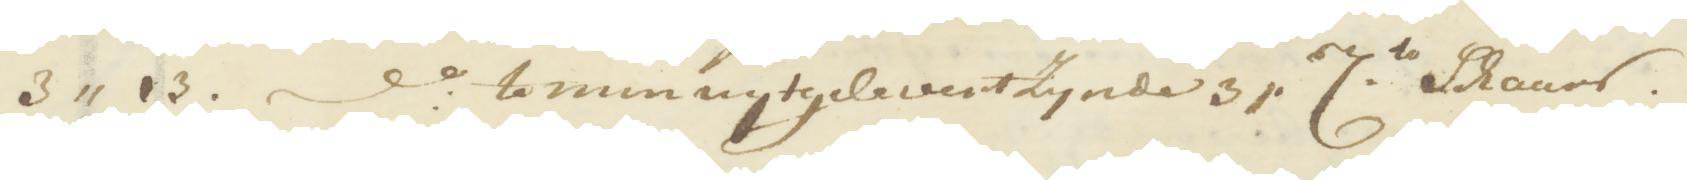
3 „ 13. _:o te min uytgelevert Zynde 3 p C.to schaars.
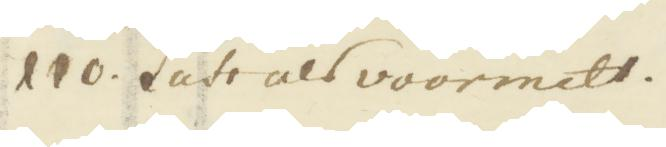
110. Laste als voormelt.
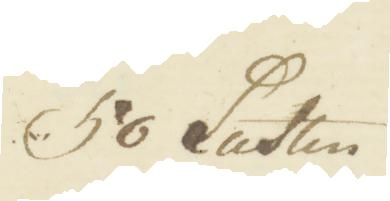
56 Lasten
